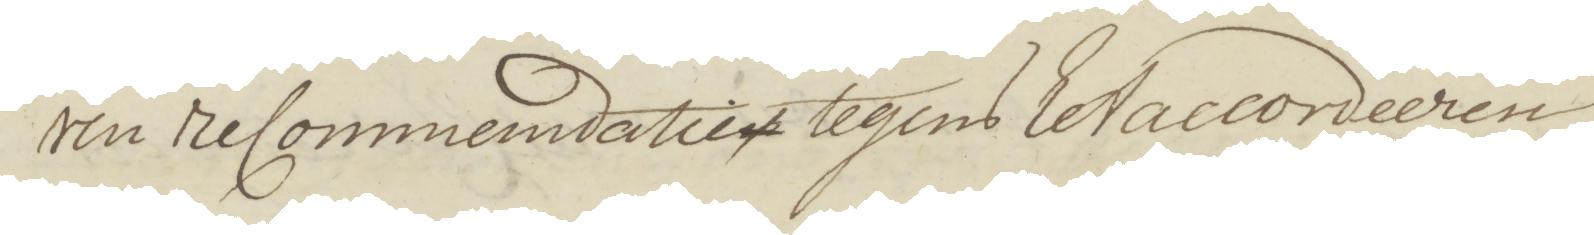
ven recommemdatie tegens het accordeeren
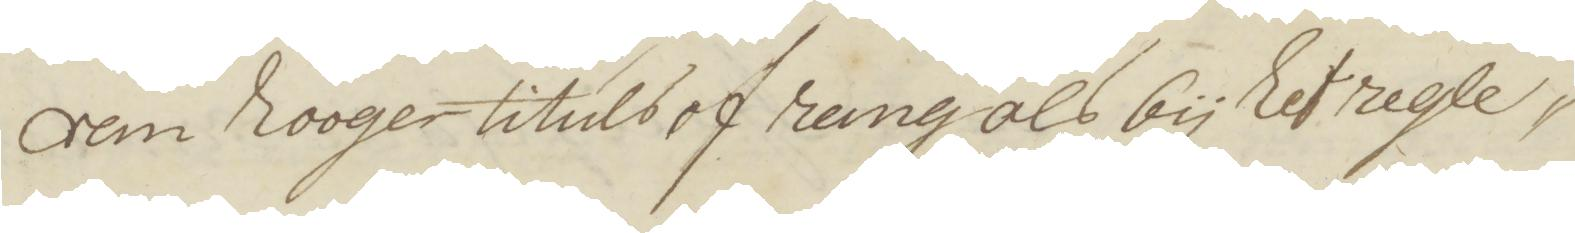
van hooger tituls of rang als bij het regle„
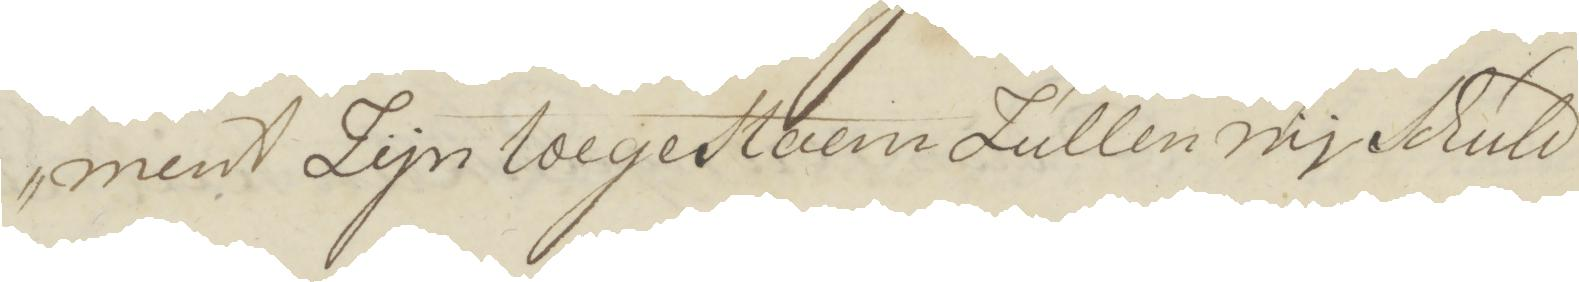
ment Zijn toegestaan Zullen wij schuld
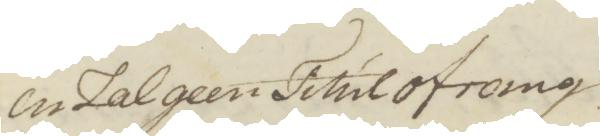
en zal geen Titul of rang
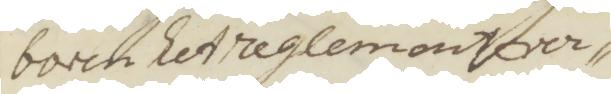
boven het reglement ver„
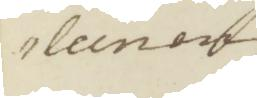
„leenen
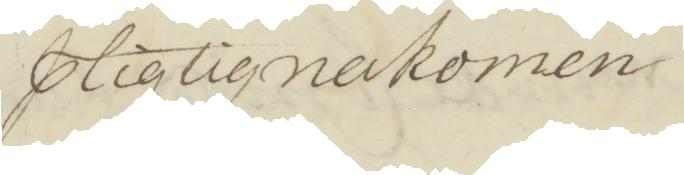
pligtig nakomen
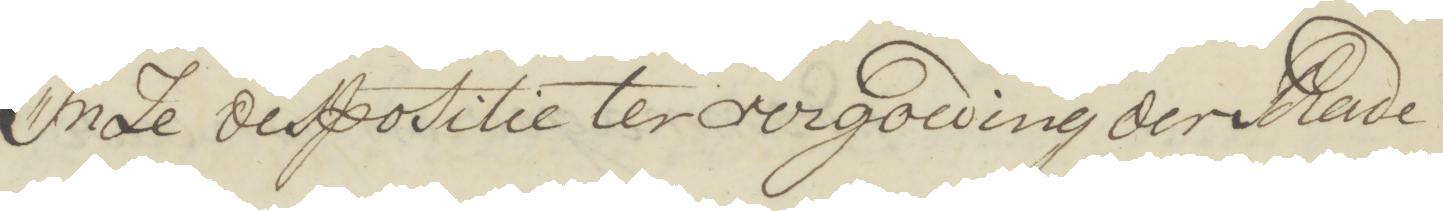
Onze dispositie ter vergoeding der schade
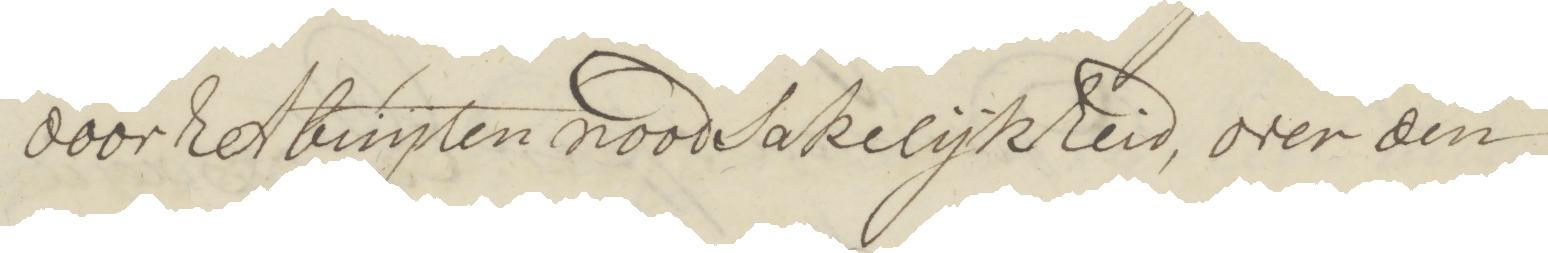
door het buijten noodsakelijkheid, over den
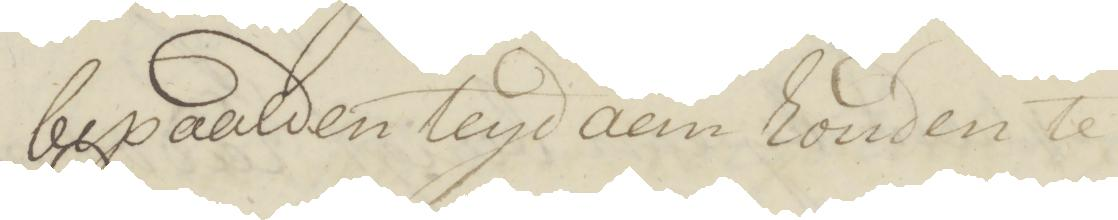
bepaalden teijd aan houden te
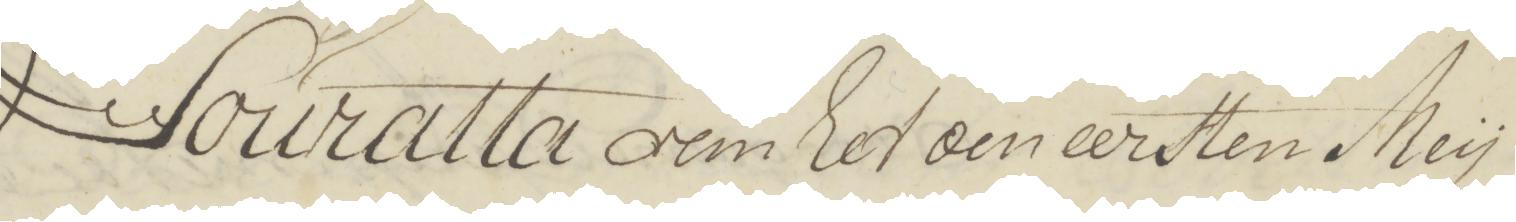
Souratta van het den eersten Meij
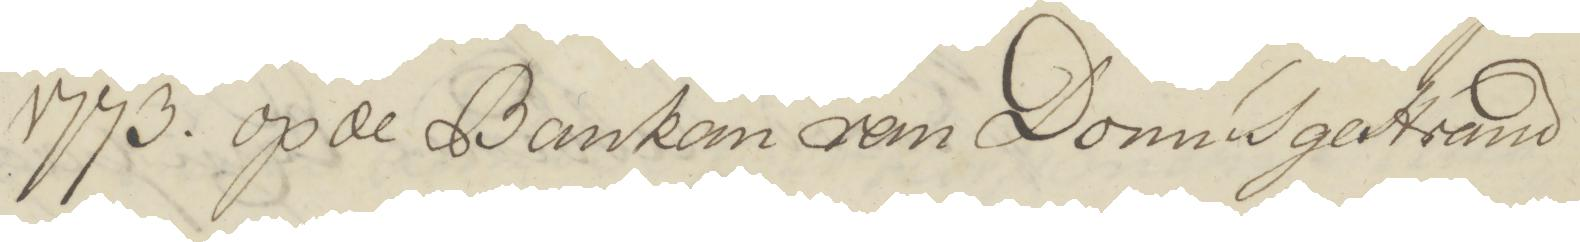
1773. op de Banken van Domus gestrand
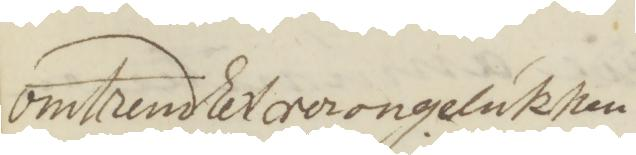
omtrend het verongelukken
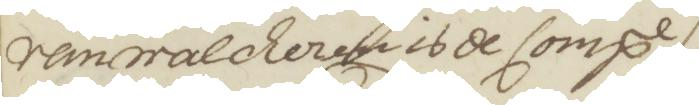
van walcheren is de Comp„e
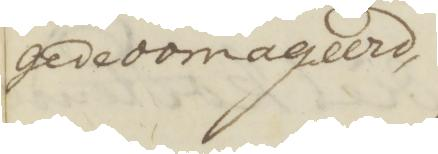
gededomageerd,
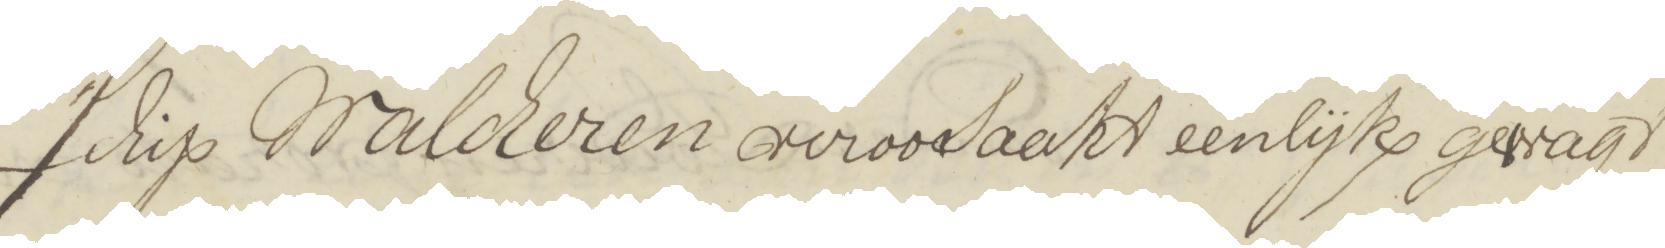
Schip Walcheren veroorsaakt eenlijk gewagt
